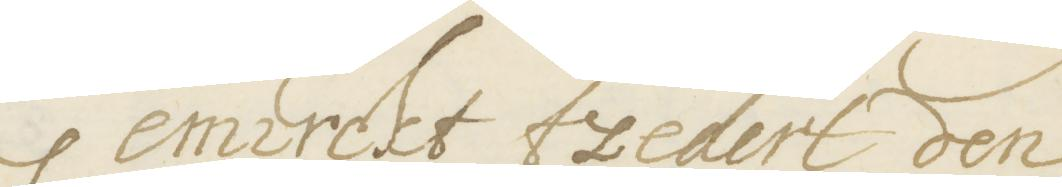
Gemerckt tzedert den
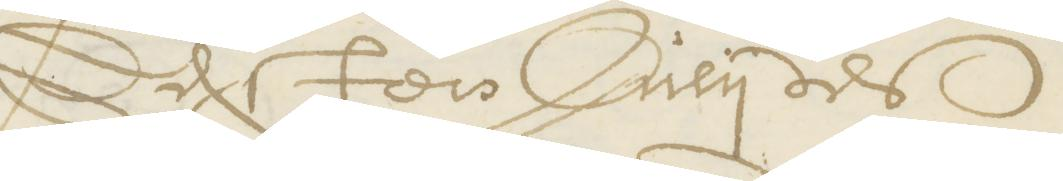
Achsten Julij des
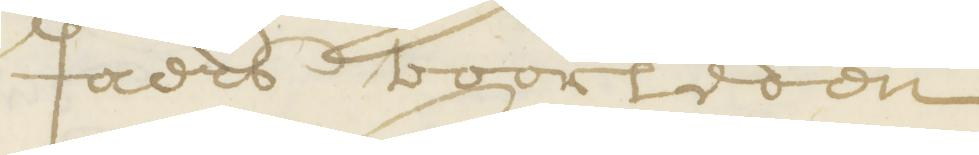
Jaers voorleden
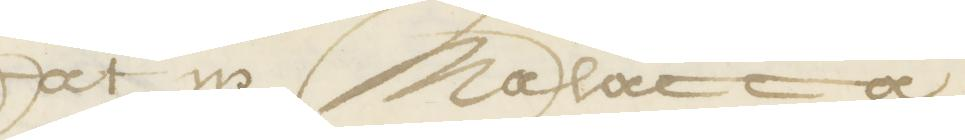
dat in Malacca
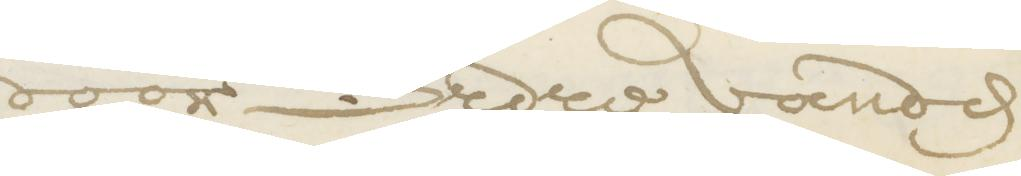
door Ordre vanden
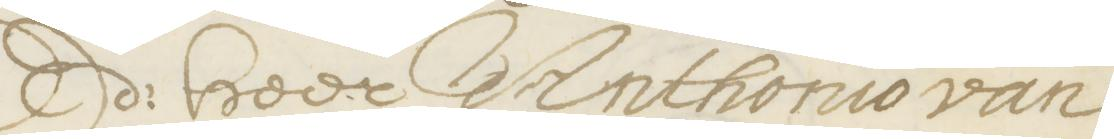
Ed: heer Anthonio van
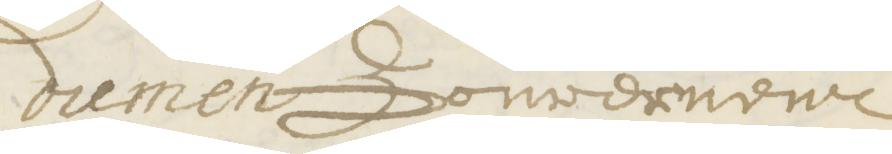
diemen Gouverneur
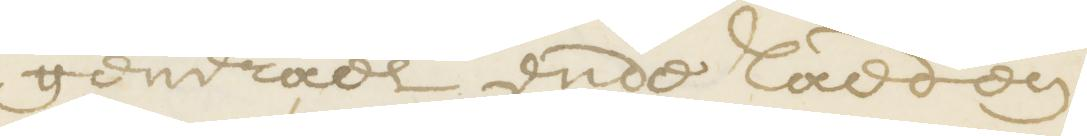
generael ende raeden
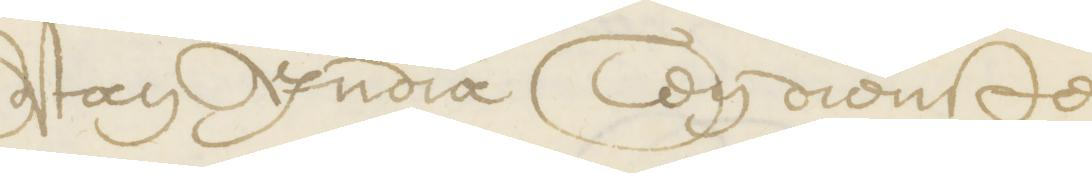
Van Jndia Ten dienste
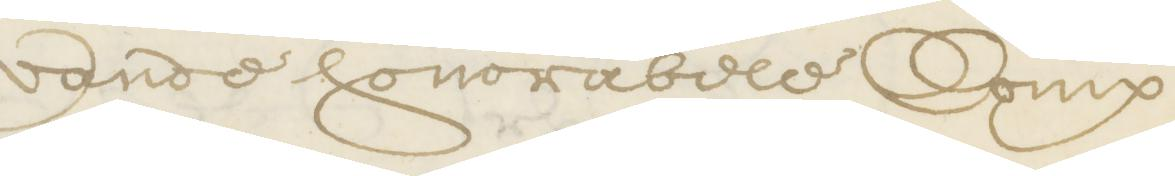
vande honorabele Compe
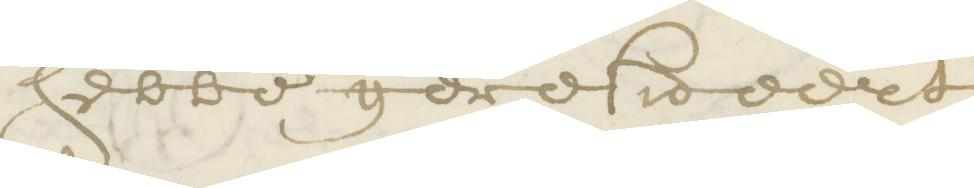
hebbe geresideert
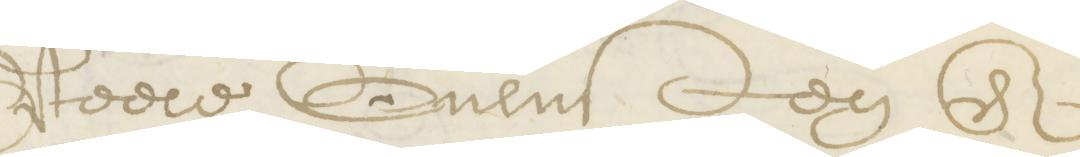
Veele Onlusten ende
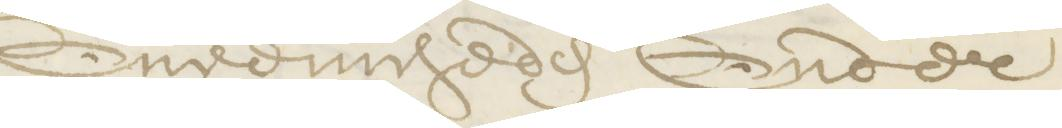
Oneenicheden Onder
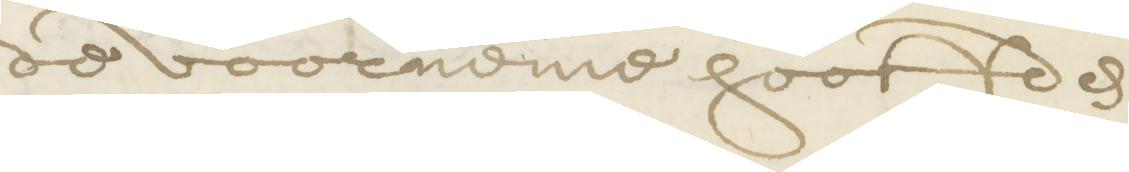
de voorneme hooffden
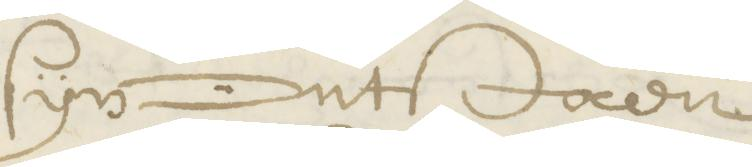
sijn Ontstaen
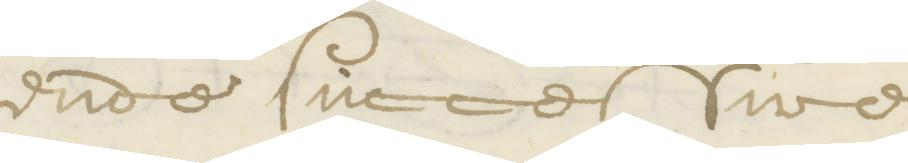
ende successive
